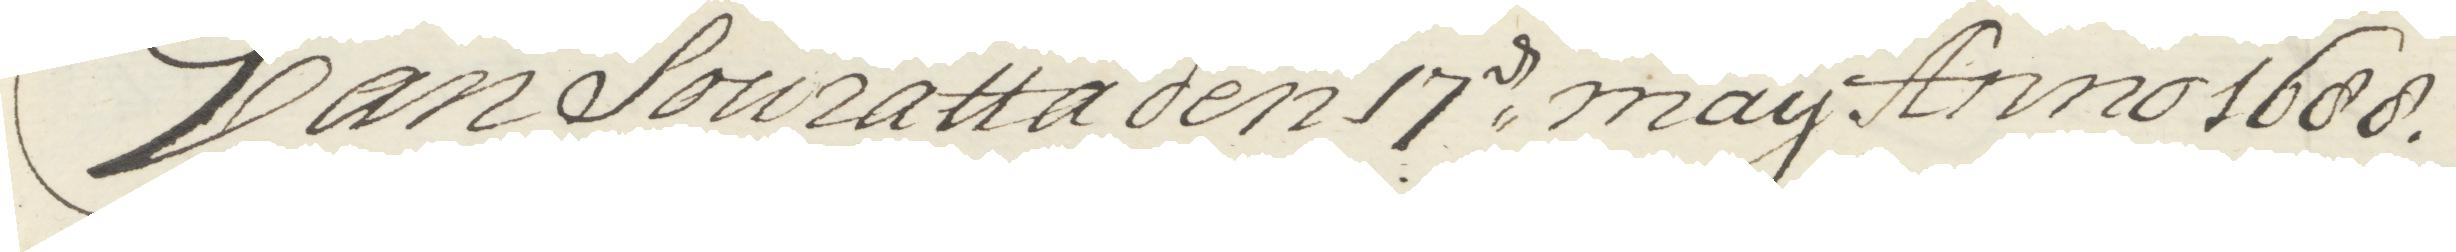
Van Souratta den 17„en maij Anno 1688.
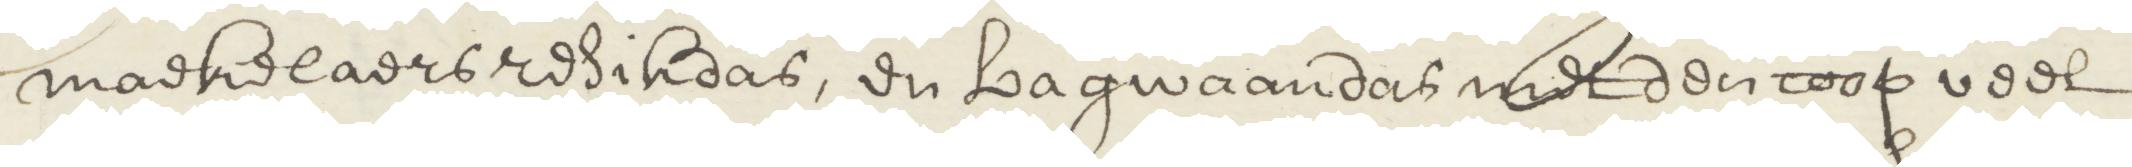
maekelaers resikdas, en Lagwaandas met den coop veel
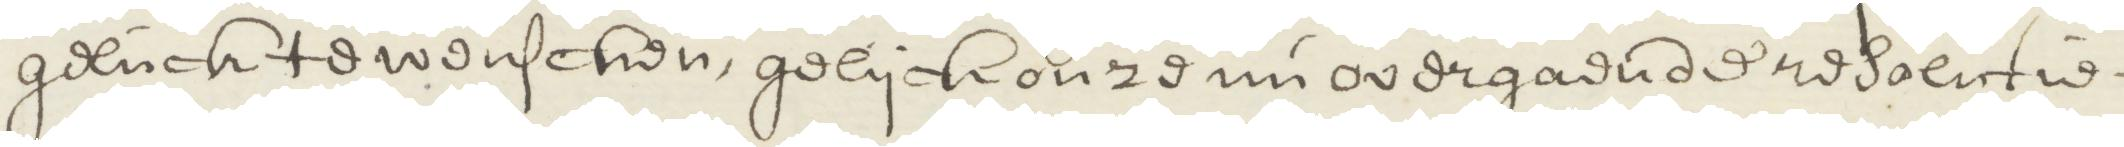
geluck te wenschen, gelijck onze nu overgaende resolutie
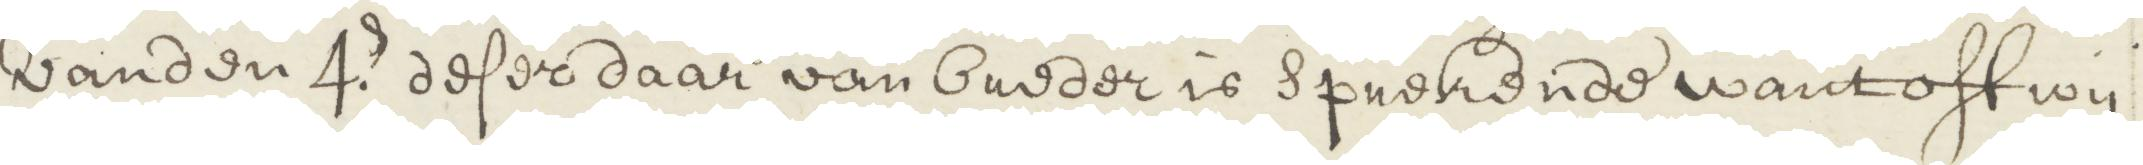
van den 4.en deser daar van breder is sprekende want off wij
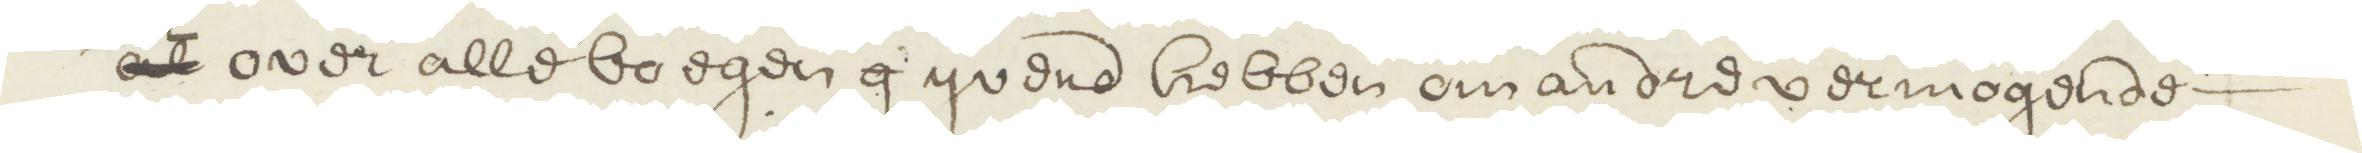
al over alle boegen g'ijverd hebben om andre vermogende —
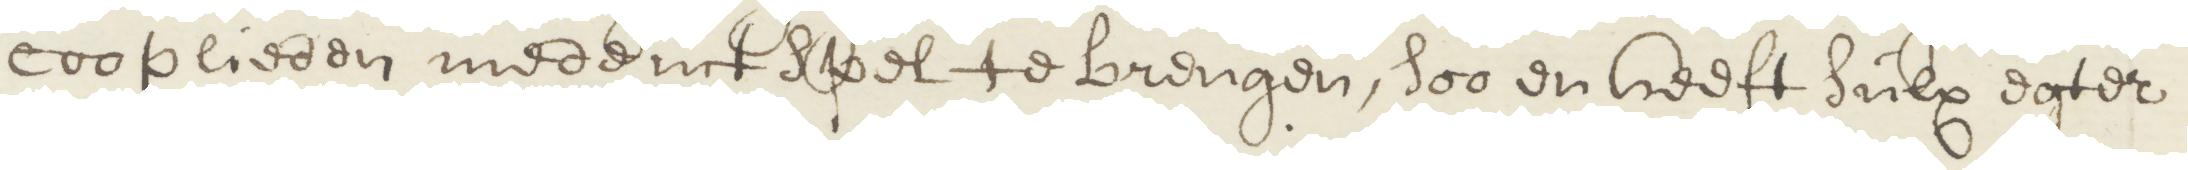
cooplieden mede int spel te brengen, soo en heeft sulx egter
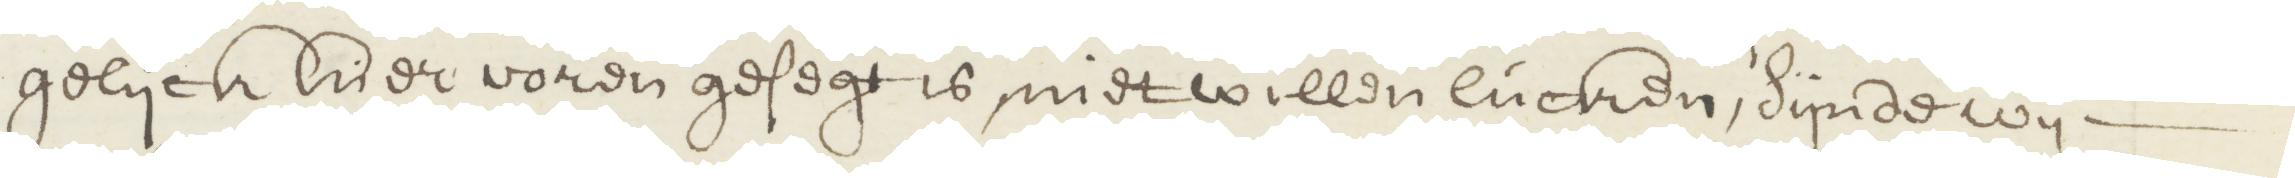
gelijck hier voren gesegt is, niet willen lucken, sijnde wij —
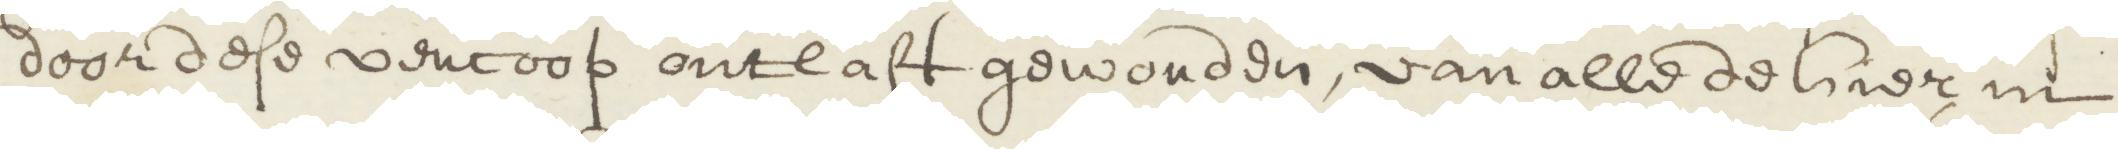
door dese vercoop ontlast geworden, van alle de hier in
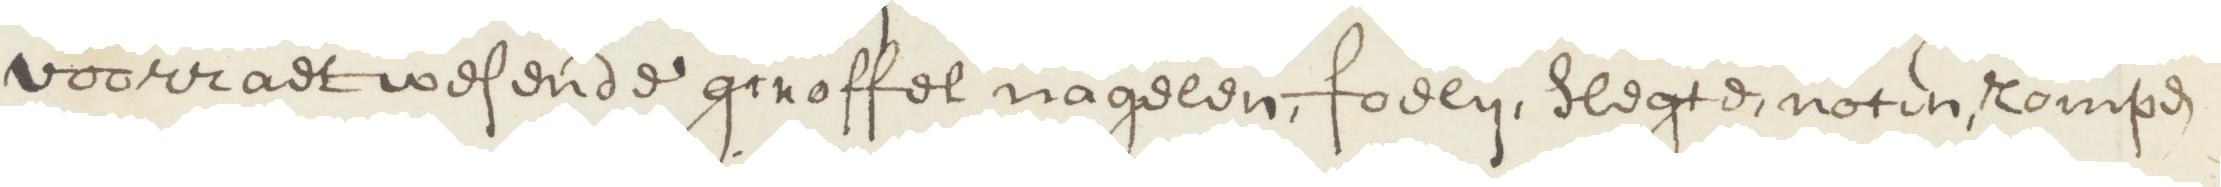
voorraet wesende giroffel nagelen, foelij, slegte, noten, rompen
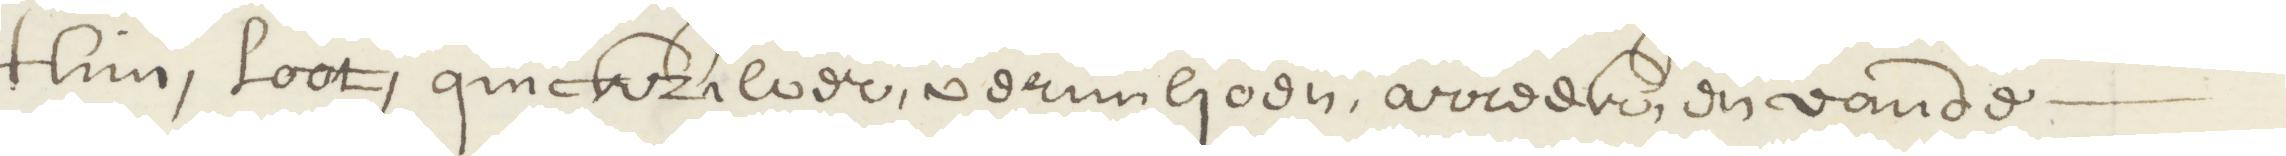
thin, loot, quickzilver, vermiljoen, arreek, en van de —
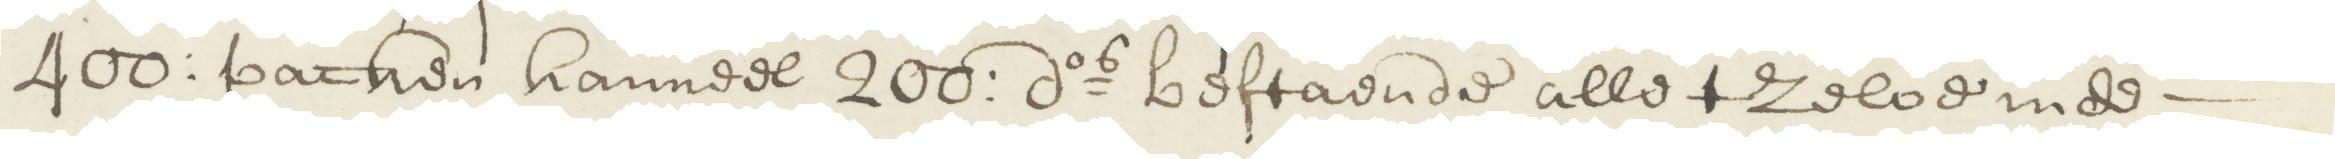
400: packen kanneel 200: d=os bestaende alle 'tzelve in de —
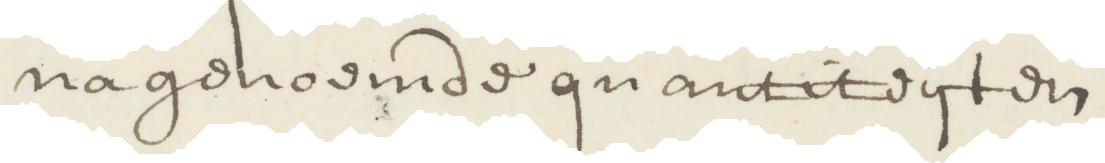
na genoemde quantiteijten
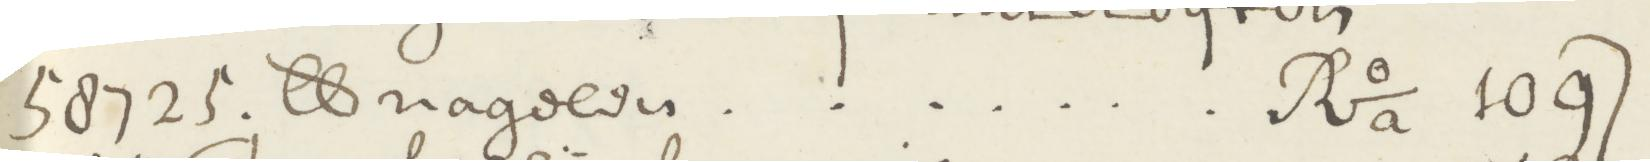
58725. lb nagelen . . . . . . . Ro/a 109
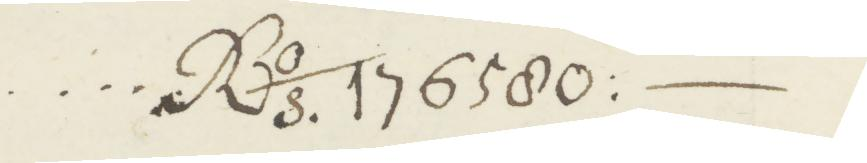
. . . . .Ro/s. 176580: —
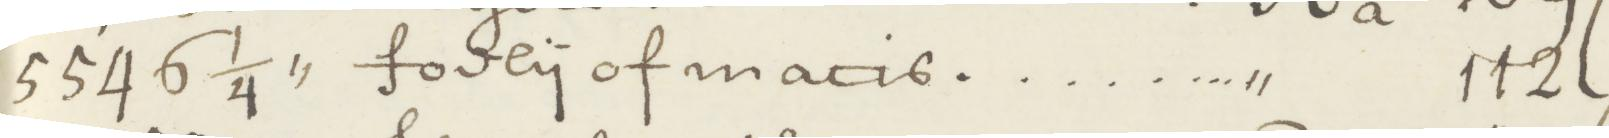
5546¼ „ foelij of macis . . . . . . . . „ 112
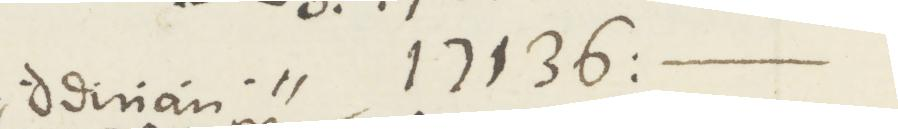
deman . „ 17136: —
